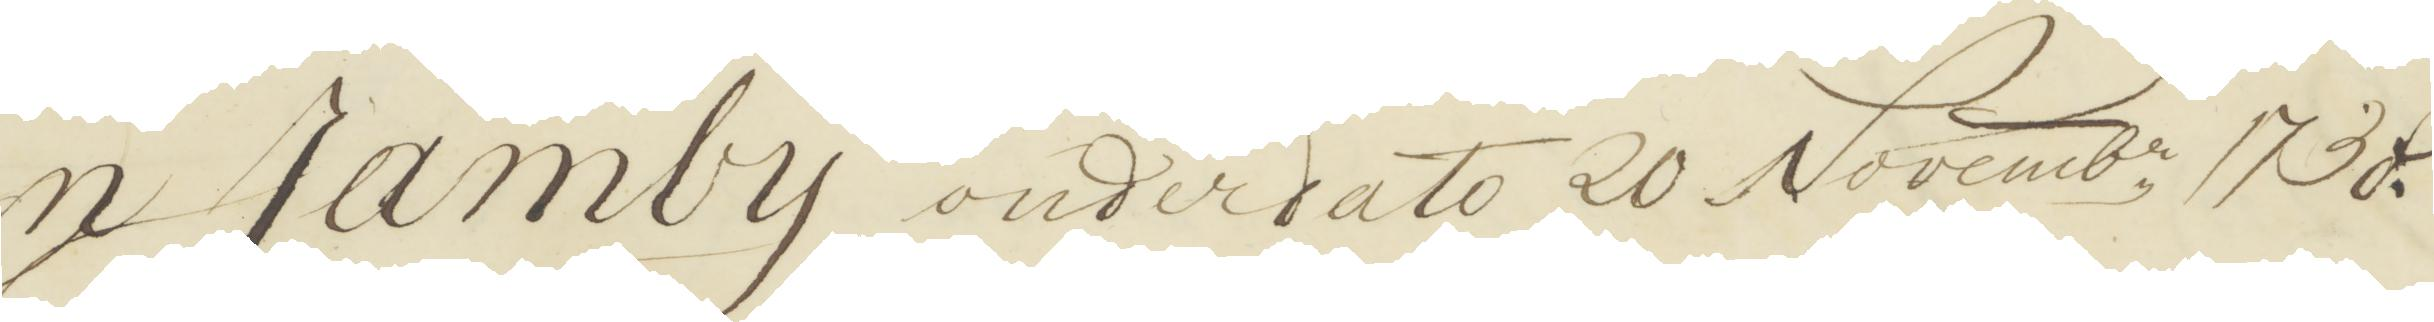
Van Jambij onder dato 20 Novemb„r 1738.
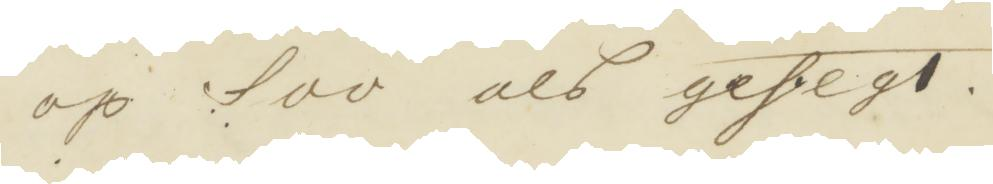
op soo als gesegt.
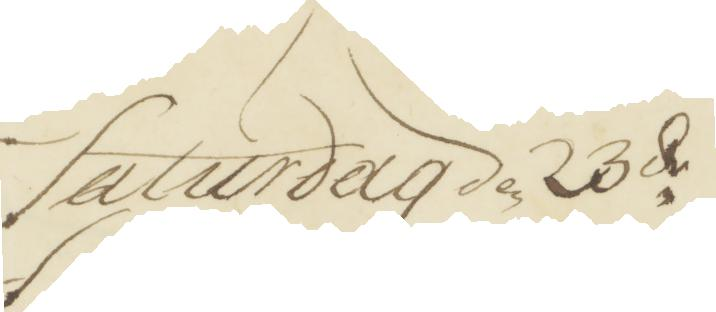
Saturdag den 23„en
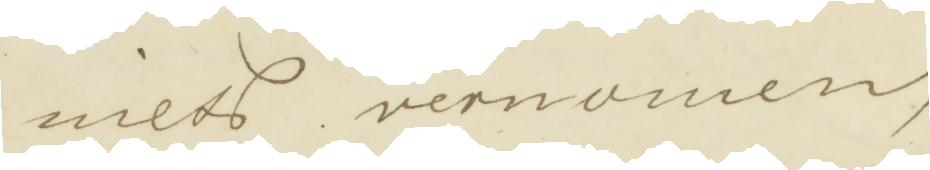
niets vernomen,
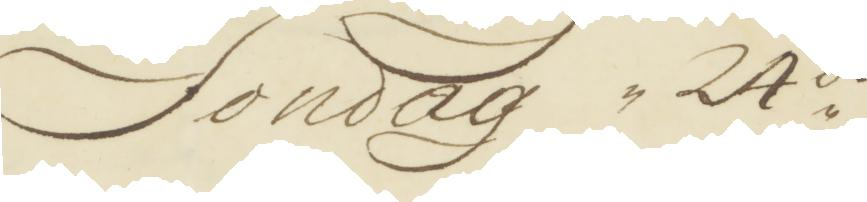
Sondag „ 24„en
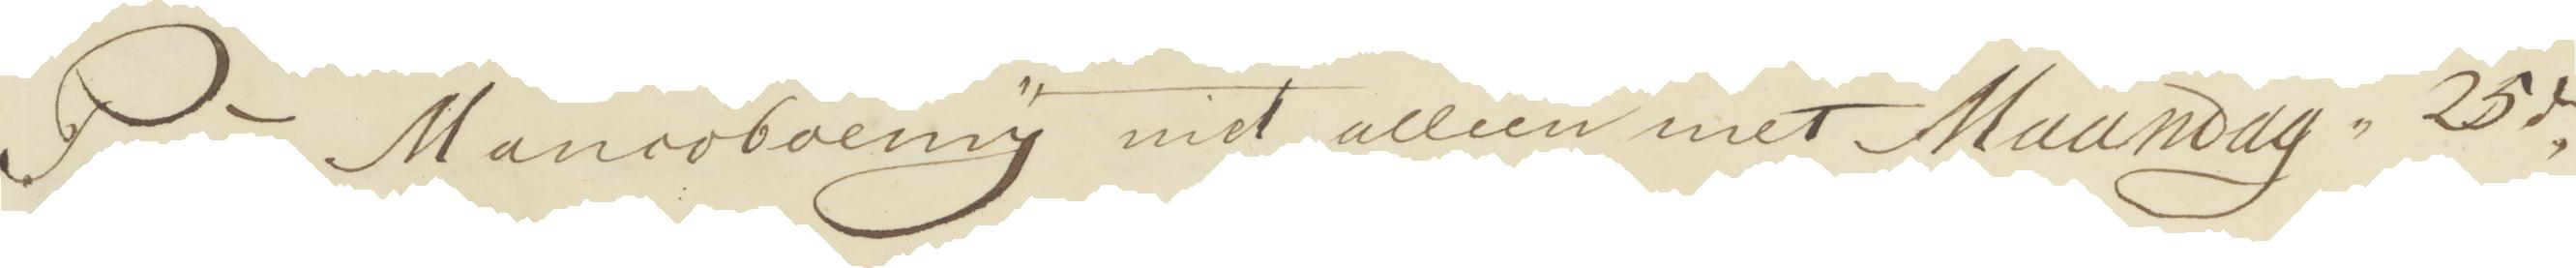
Pang: Mancooboemij niet alleen met Maandag „ 25„en
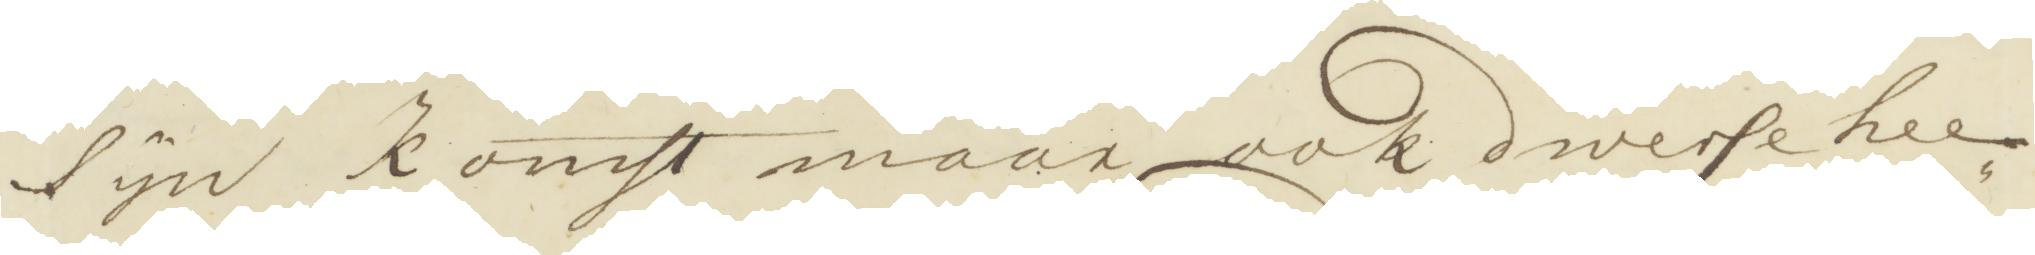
sijn komst maar ook diverse hee„
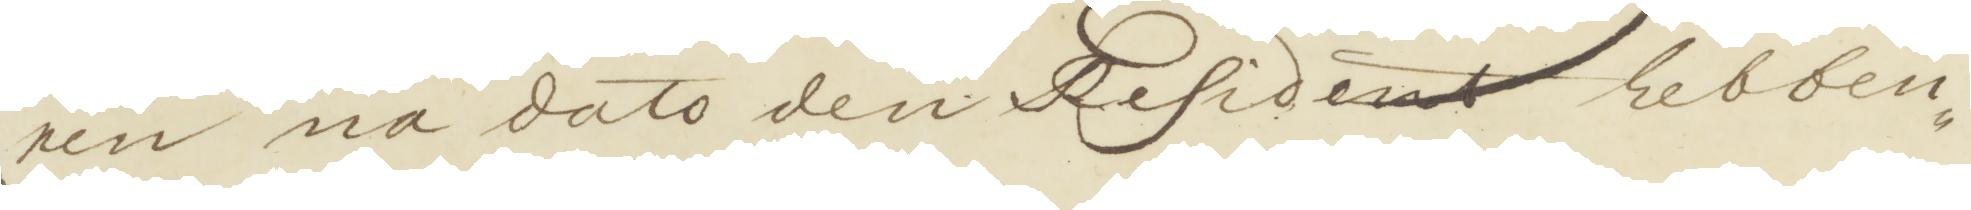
ren na dato den Resident hebben„
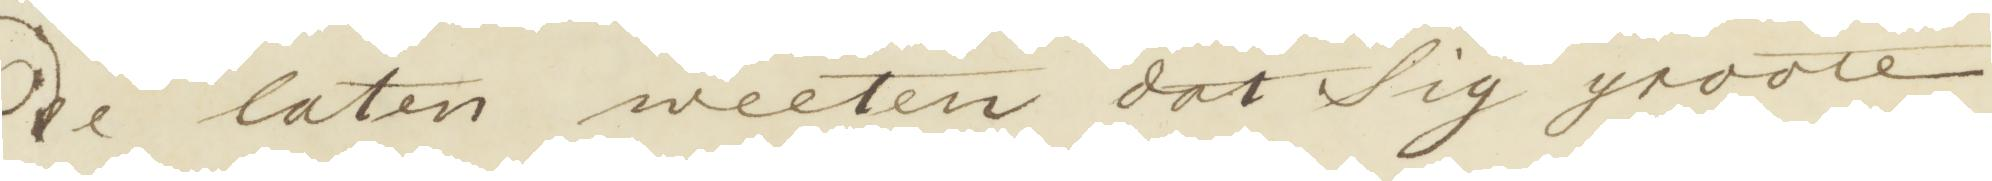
de laten weeten dat sig groote
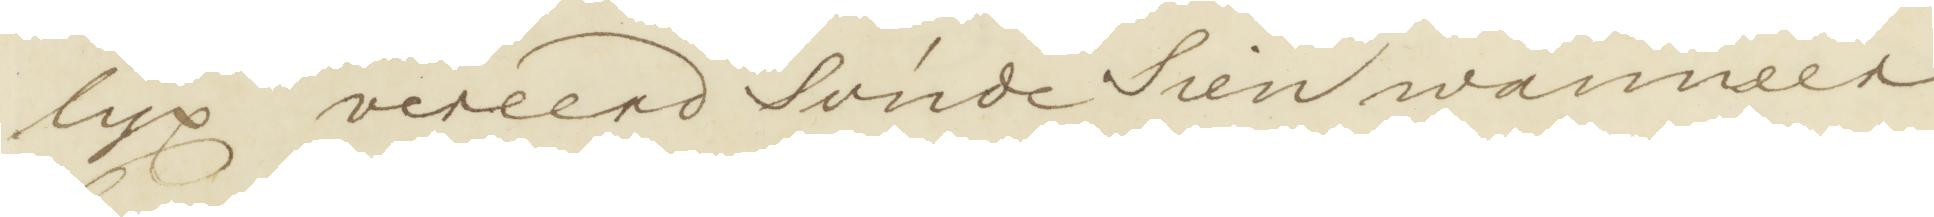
lijx vereerd soude sien wanneer
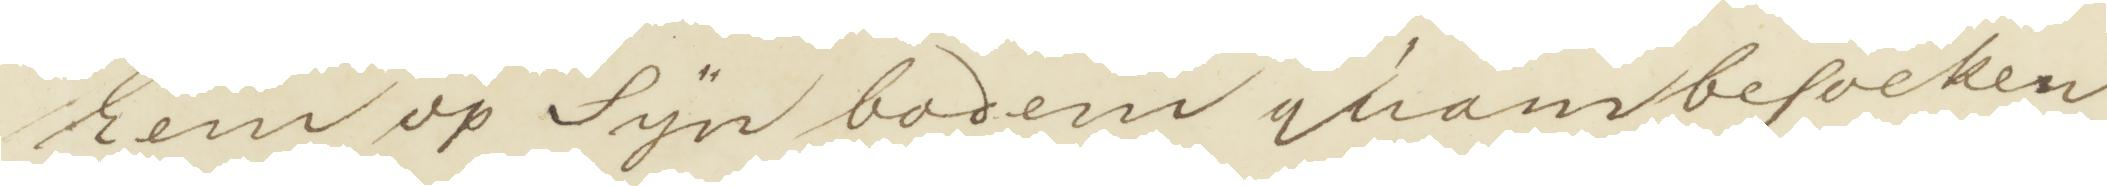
hem op sijn bodem quam besoeken
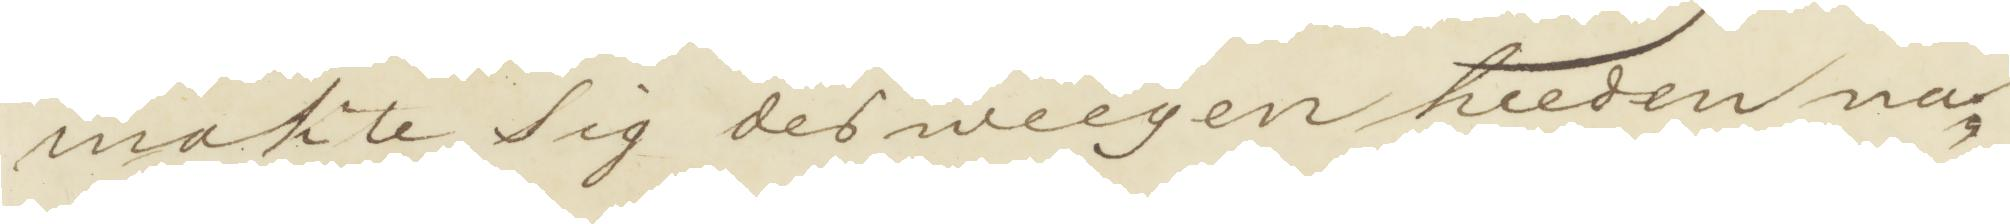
makte sig des weegen heeden na„
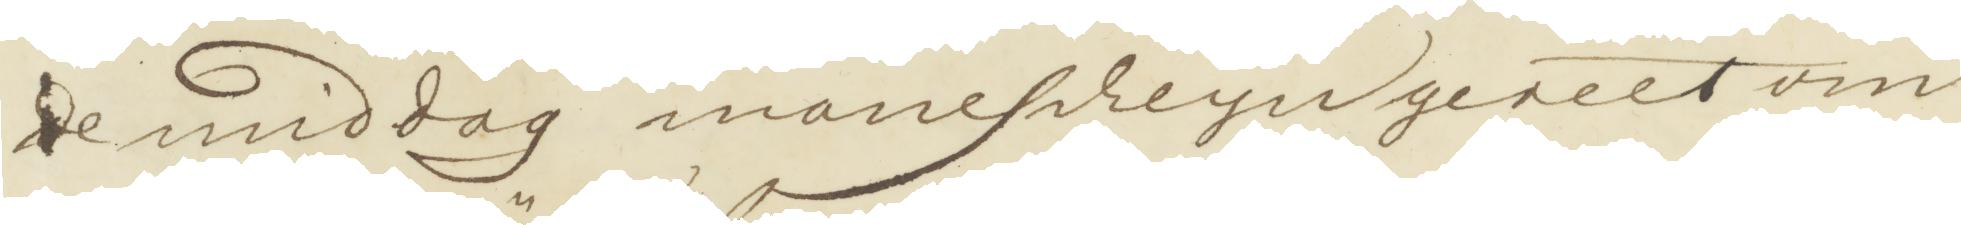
de middag manescheijn gereet om
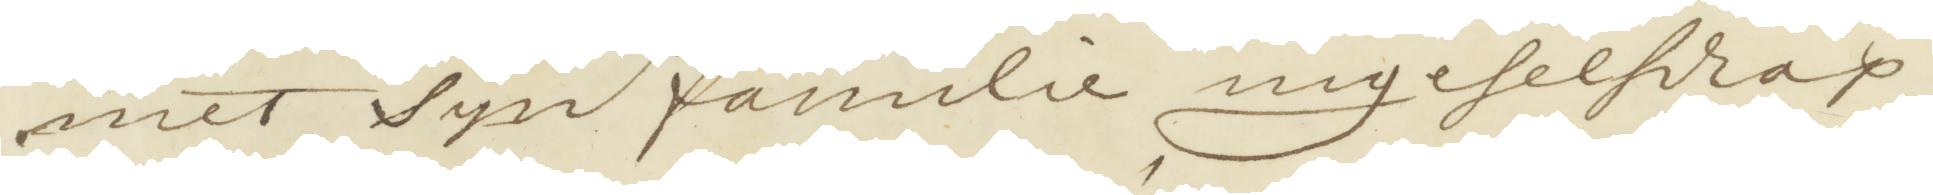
met sijn familie in geselschap
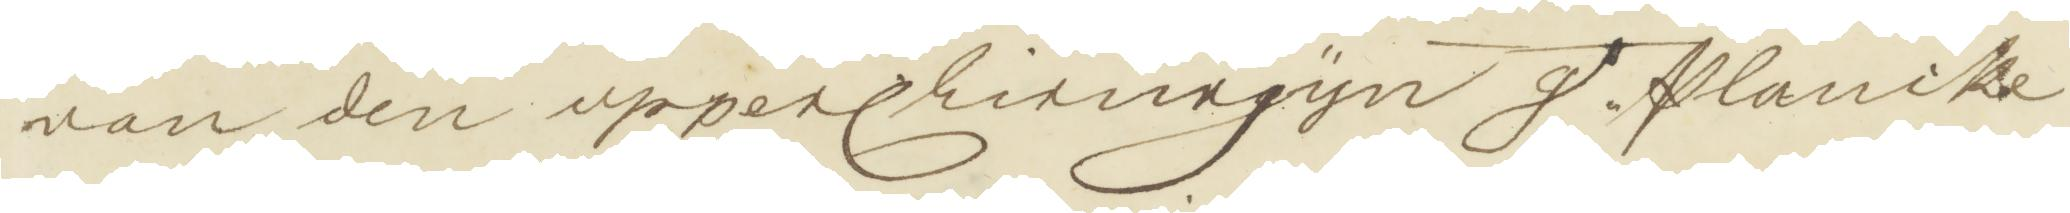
van den opperchirurgijn g„t plancke
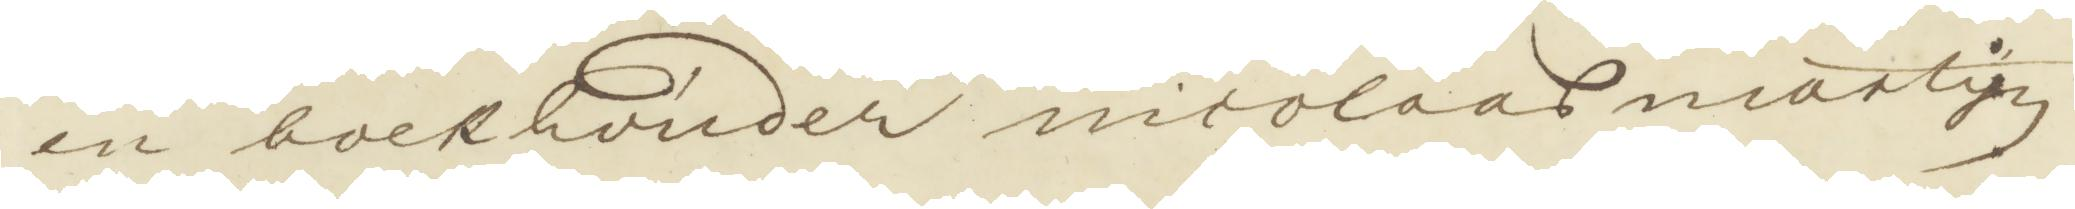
en boekhouder nicolaas martijn
